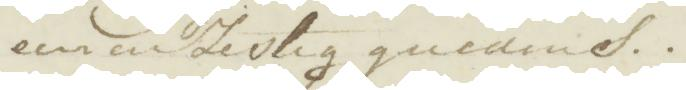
een en zestig guldens. .
